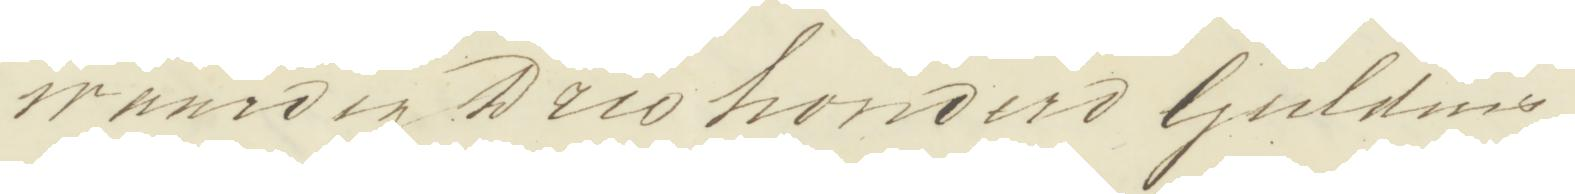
waardig Drie honderd Guldens
